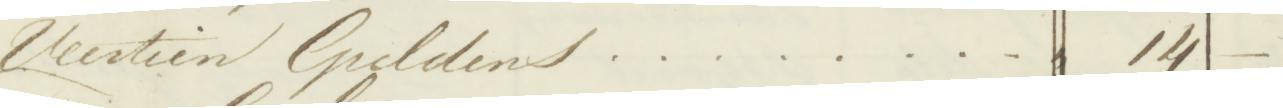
Veertien Guldens . . . . . . . . „ 14 —
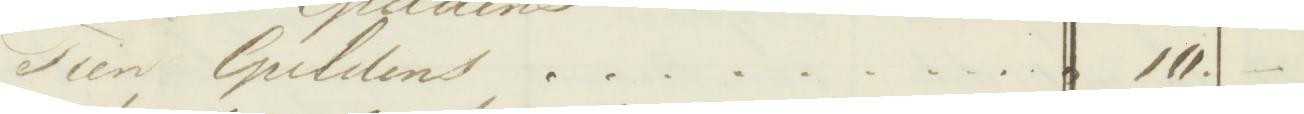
Tien Guldens . . . . . . . . . . . „ 10. —
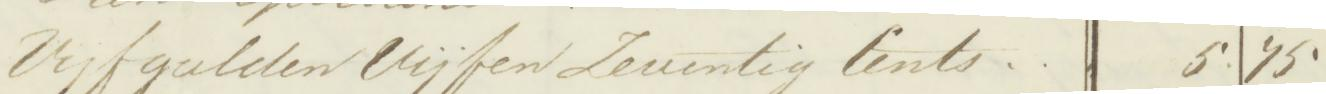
Vijf gulden Vijfen Zeventig Cents . . „ 5.75
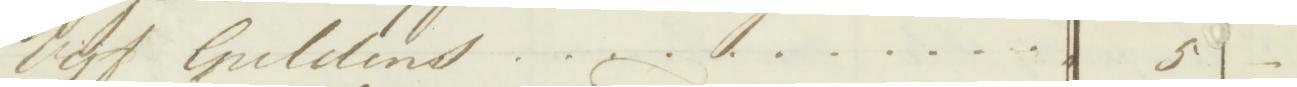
Vijf Guldens . . . . . . . . . . . „ 5 —
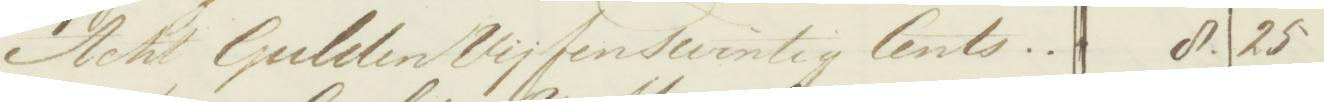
Acht Gulden VijfenTwintig Cents . . „ 8.25
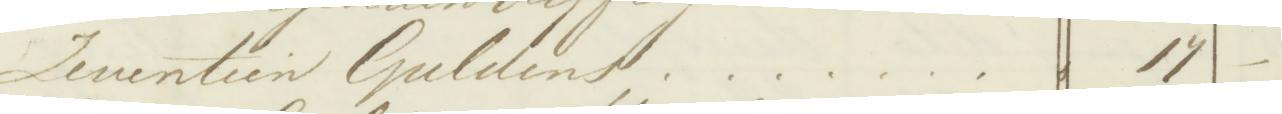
Zeventien Guldens . . . . . . . „ 17 —
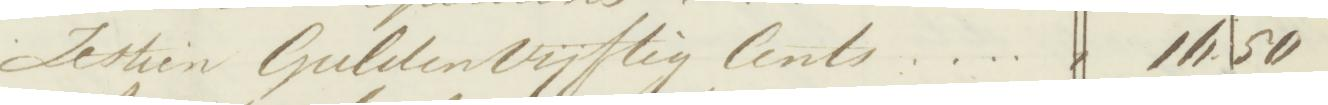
Zestien Gulden vijftig Cents . . . . „ 16.50
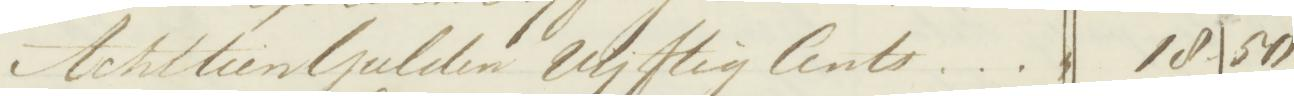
Achttien Gulden vijftig Cents . . . „ 18.50
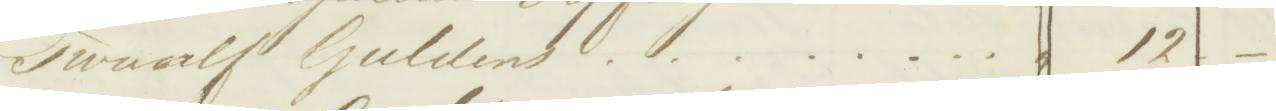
Twaalf Guldens . . . . . . . . „ 12.—
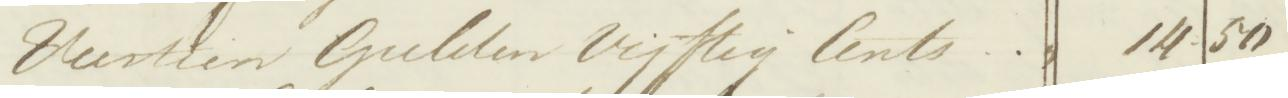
Veertien Gulden Vijftig Cents . . „ 14.50
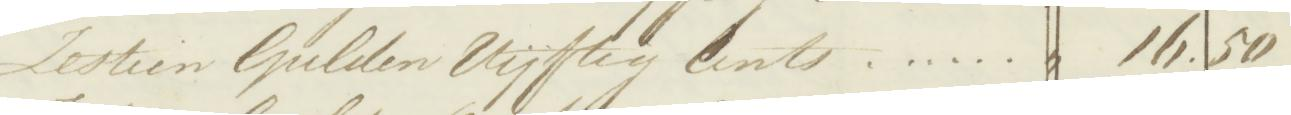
Zestien Gulden Vijftig Cents . . . . . . „ 16.50
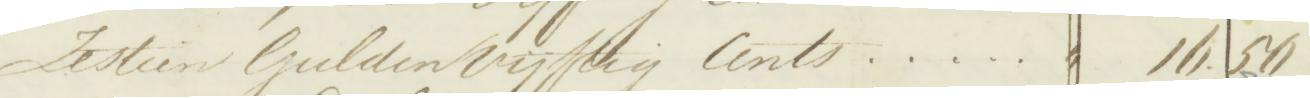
Zestien Gulden vijftig Cents . . . . . „ 16.50
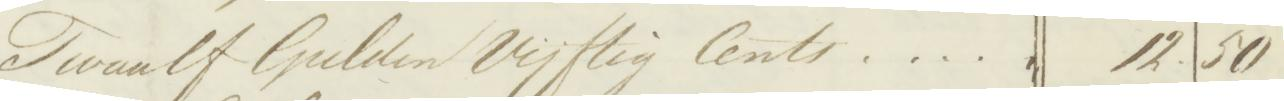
Twaalf Gulden vijftig Cents . . . . „ 12.50
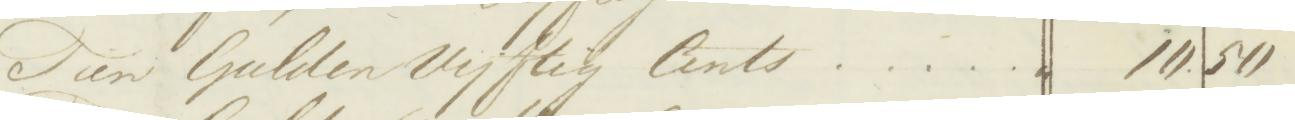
Tien Gulden Vijftig Cents . . . . . „ 10.50
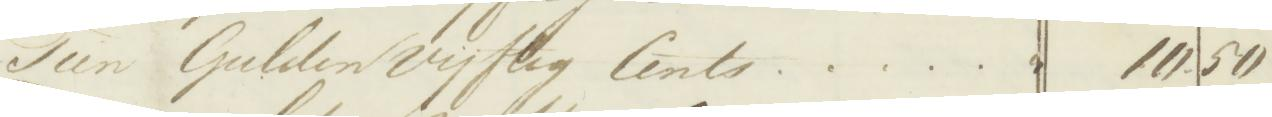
Tien Gulden vijftig Cents . . . . . „ 10.50
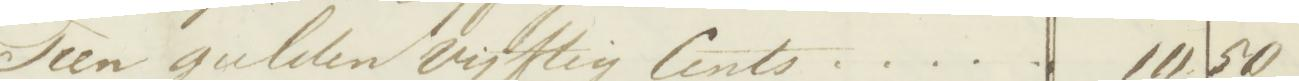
Tien gulden vijftig Cents . . . . . „ 10.50
